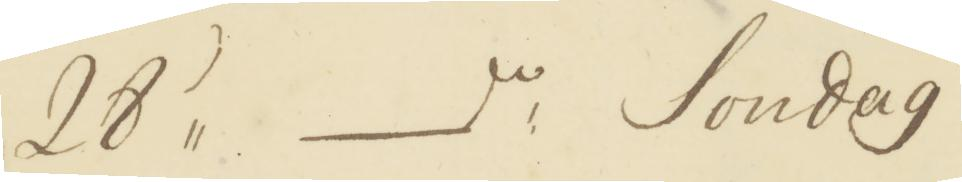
28„' _„o sondag
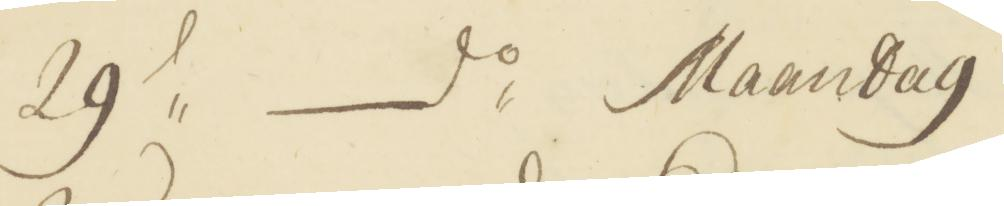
29„' _„o Maandag
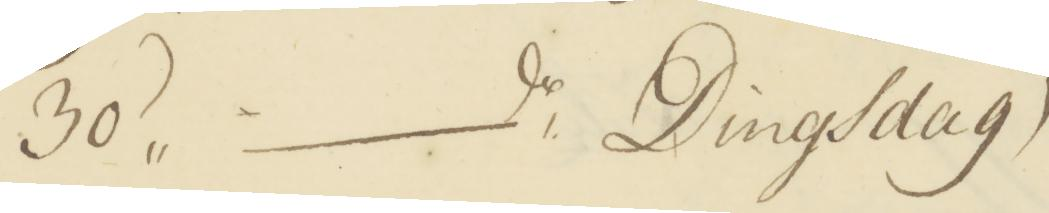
30„' _„o Dingsdag
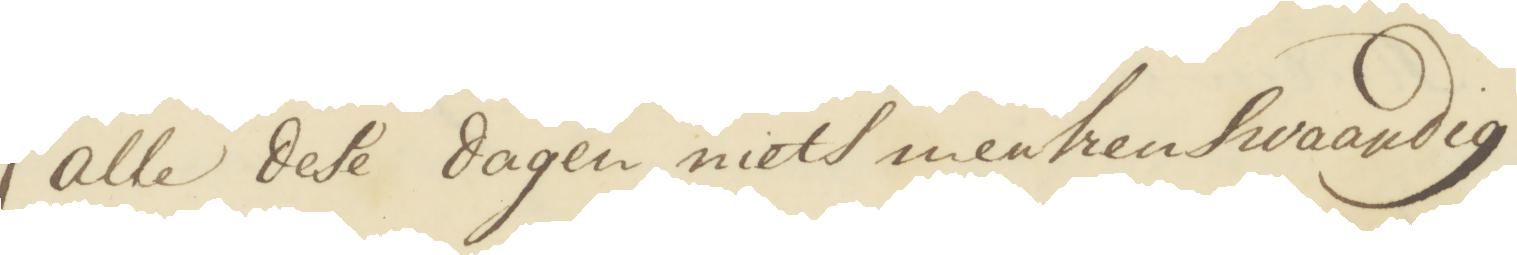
alle dese dagen niets merkenswaardig
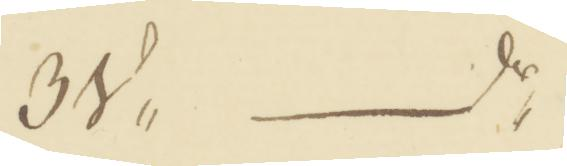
31„' _„o
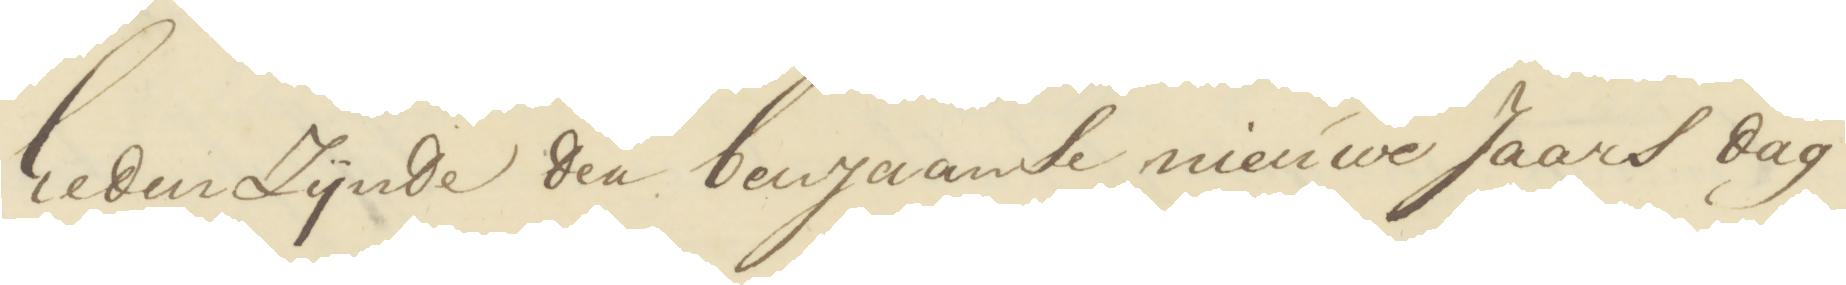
heden zijnde der benjaanse nieuwe Jaars dag
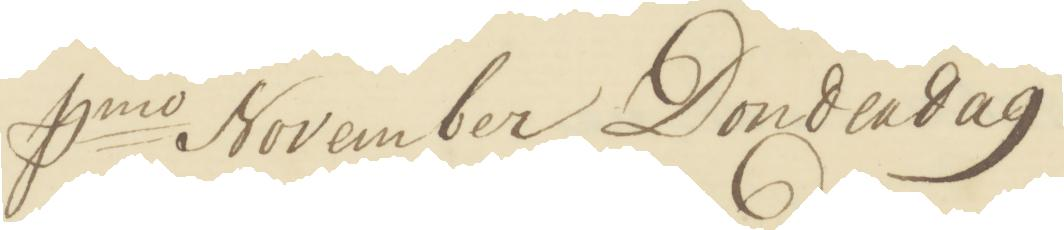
p=mo November Donderdag
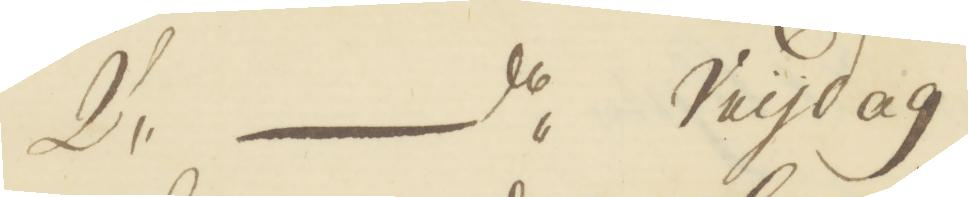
2„' _„o vrijdag
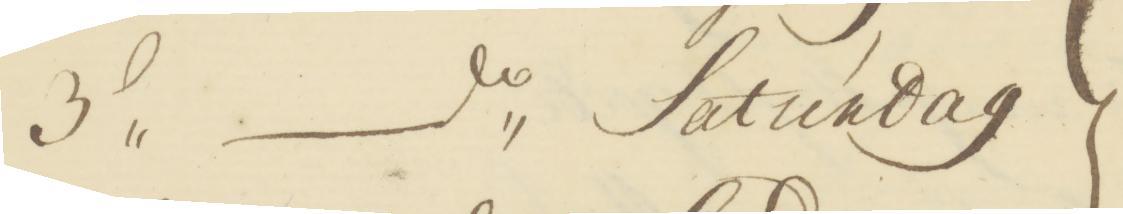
3„' _„o saturdag
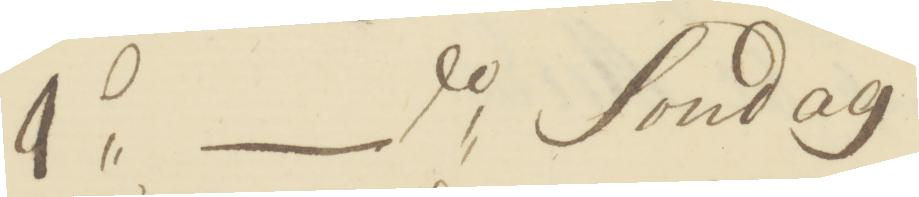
4„' _„o sondag
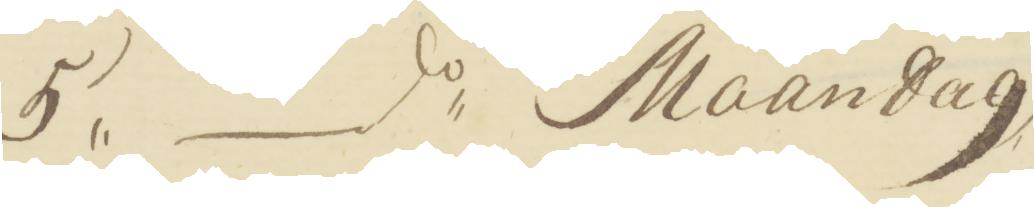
5„' _„o Maandag
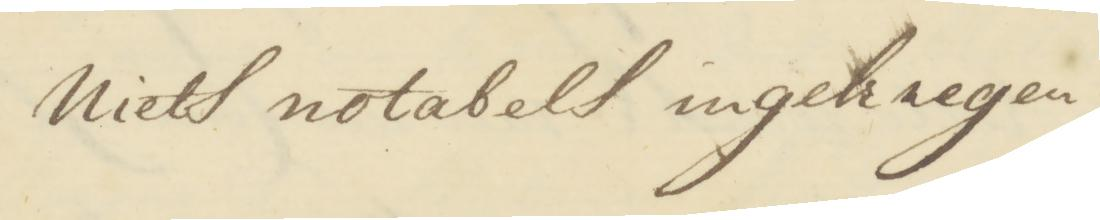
niets notabels ingekregen
